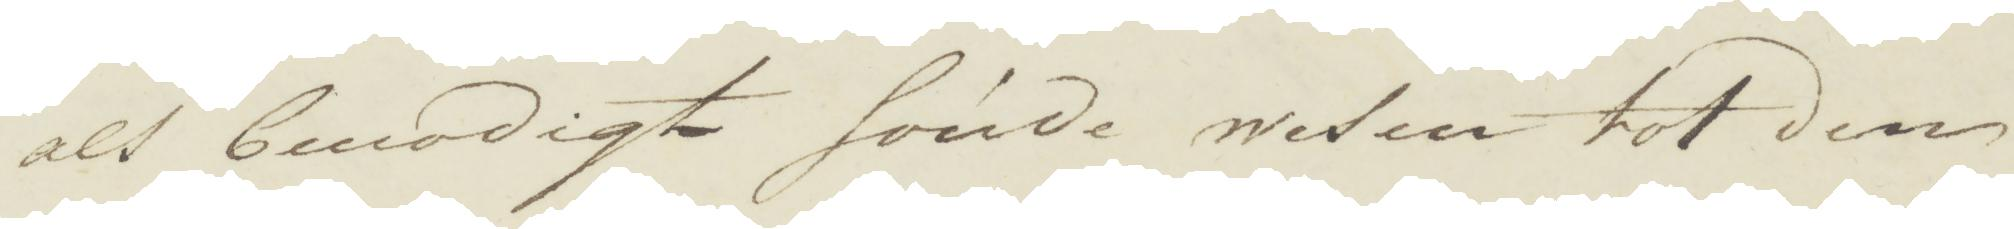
als benodigt Soude wesen tot den
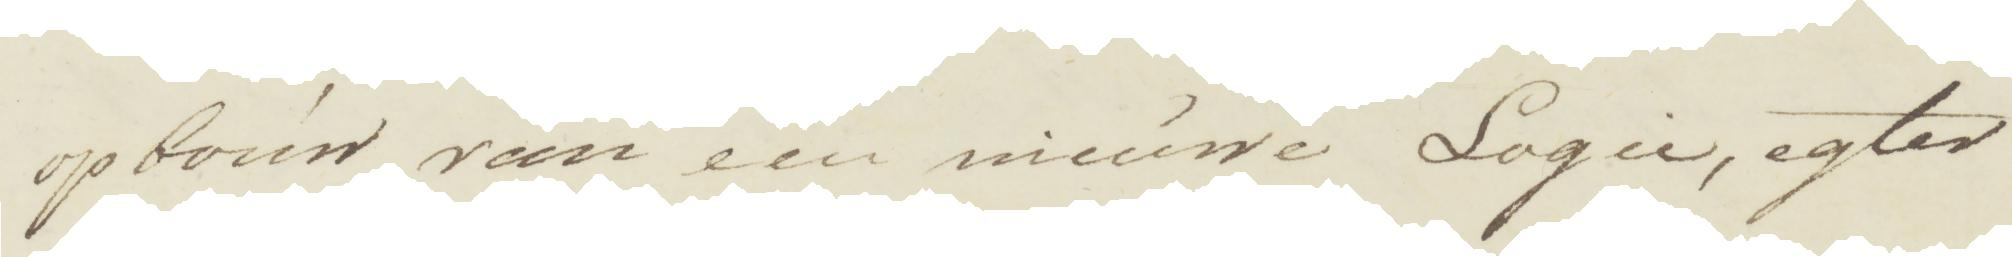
op bouw van een nieuwe Logie, egter
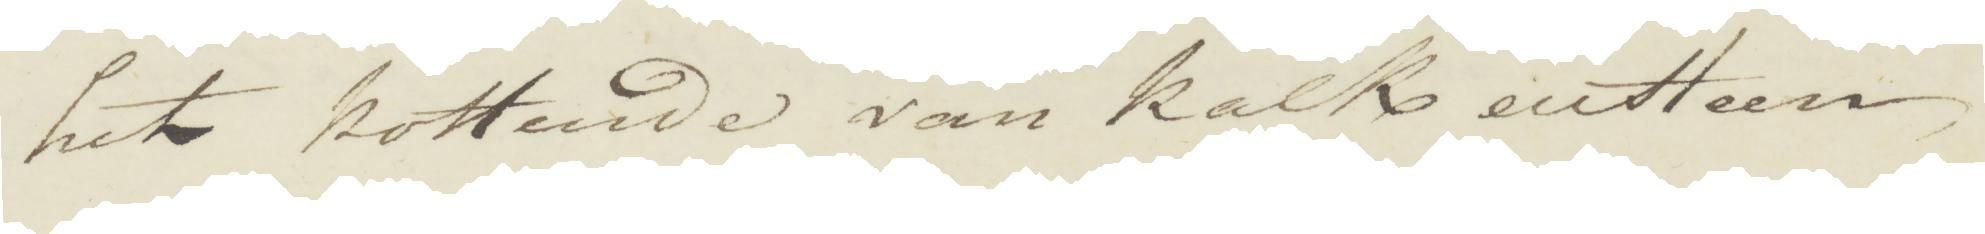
het kostende van kalk en steen,
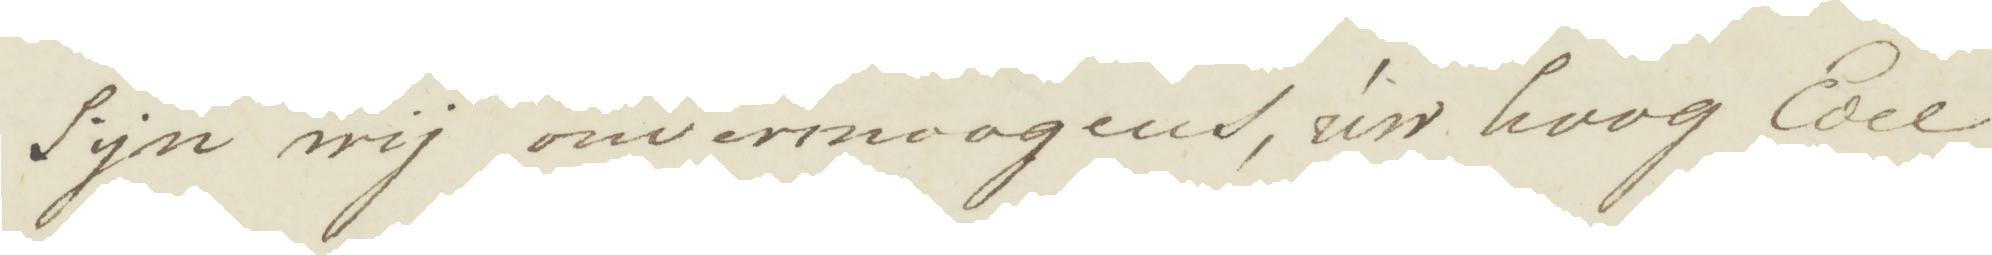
sijn wij onvermoogens, uw hoog Edel„
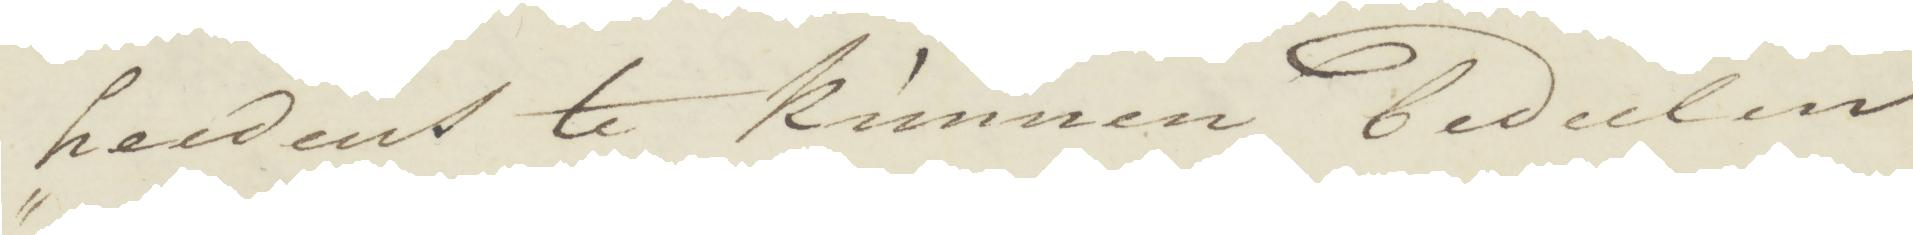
„heedens te kunnen bedeelen
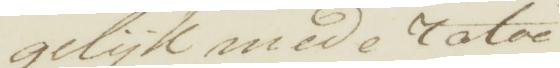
gelijk mede ratoe
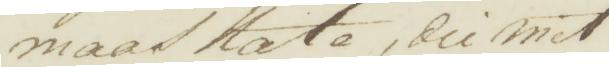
maas kate, die niet
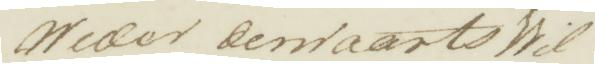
weder derwaarts wil
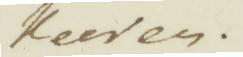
keeren.
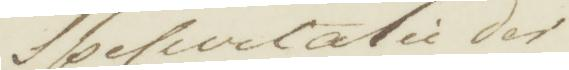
specivicatie der
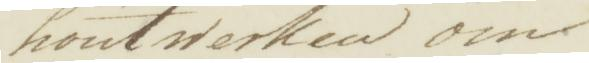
hout werken om
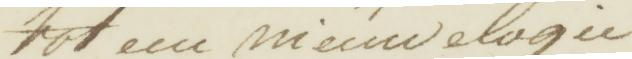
tot een nieuwe logie
